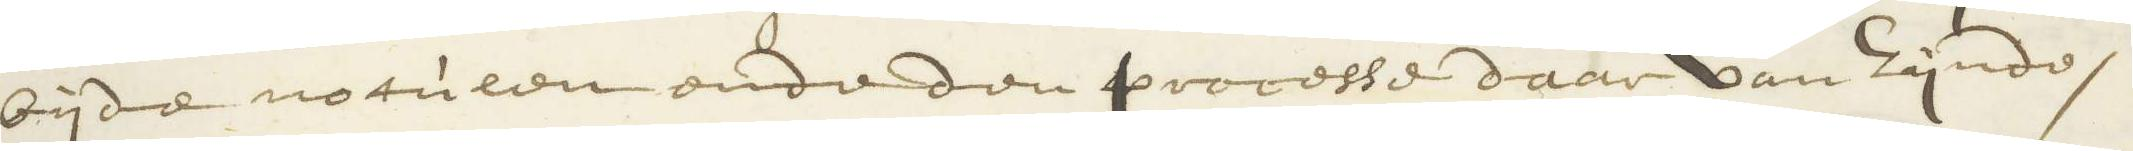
bij de notulen ende den processe daar van zijnde /
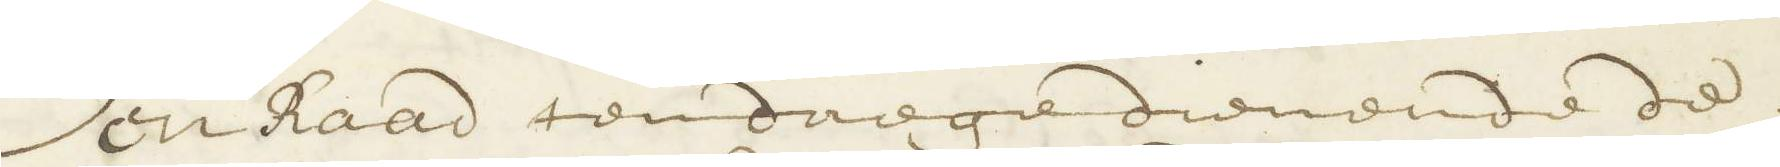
Den Raad ten daege dienende de
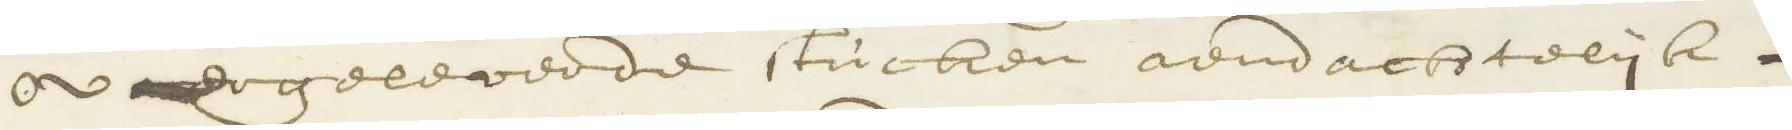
overgeleverde stucken aendachtelijk
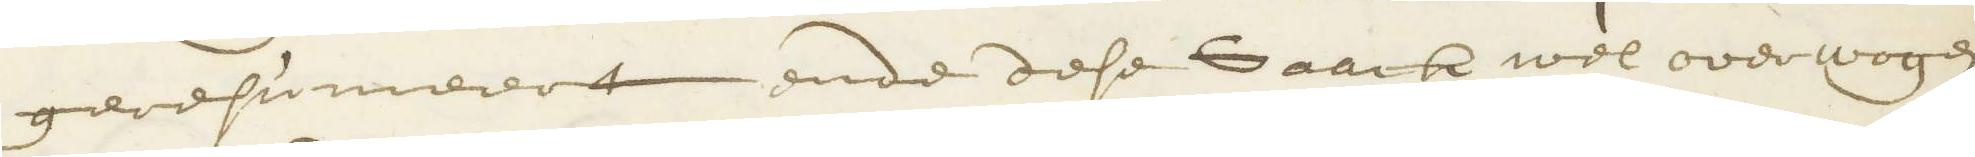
geresumeert ende dese saack wel overwogen
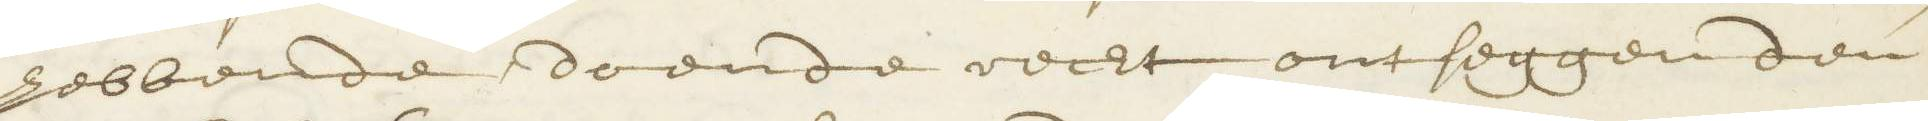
hebbende, doende recht ontseggen den
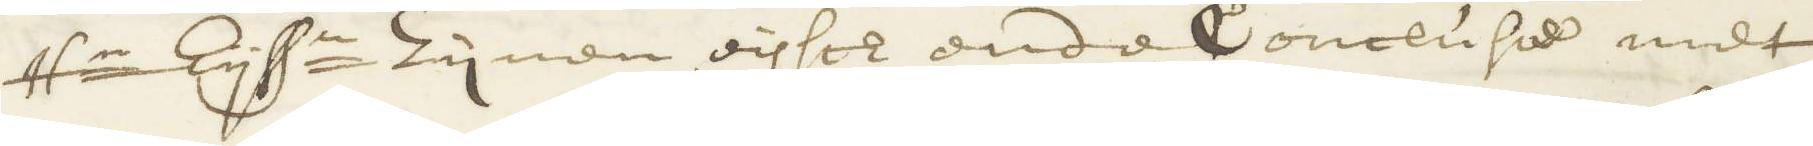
H=r Eijss=r zijnen eijsch ende Conclusie met
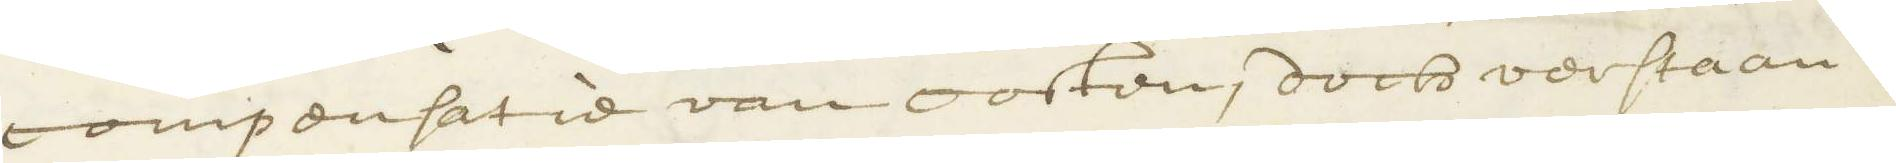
compensatie van oosten, doch verstaan
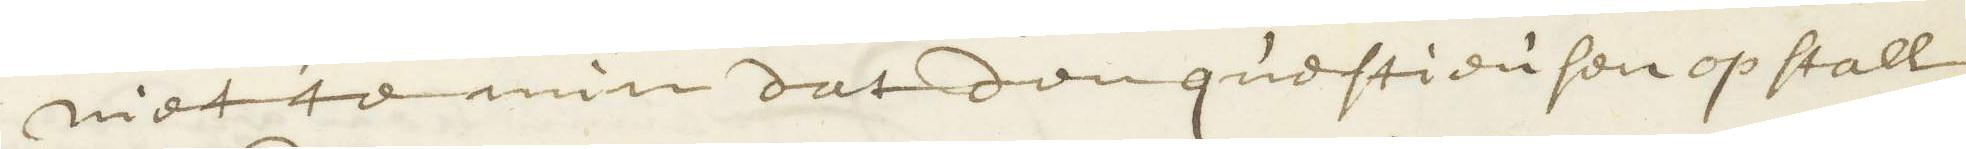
niet te min dat den questieusen op stall
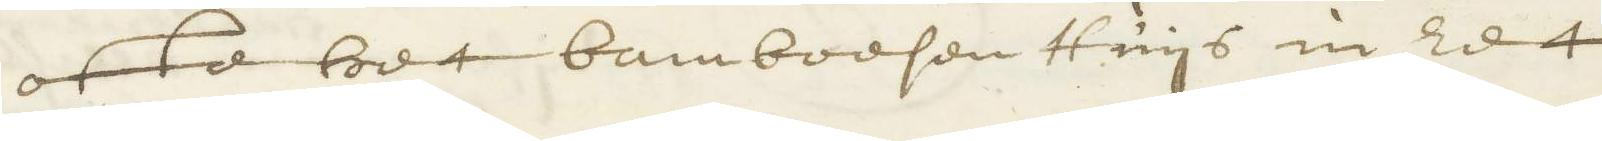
ofte het bamboesen Huijs in het
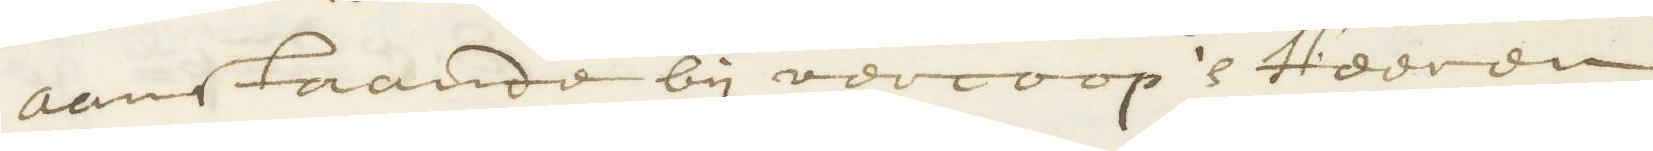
aanstaande bij vercoop 's Heeren
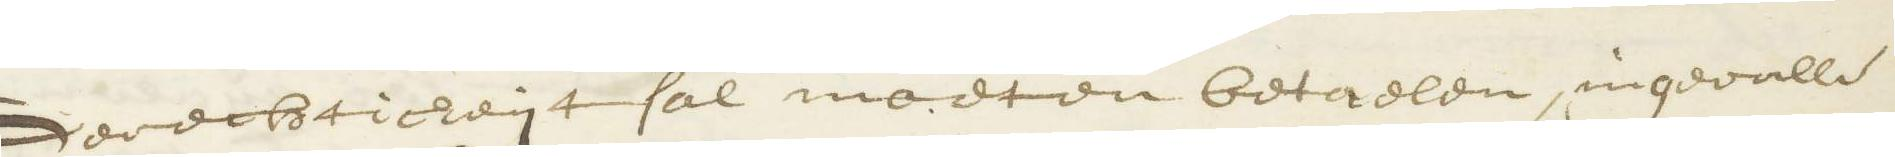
Gerechticheijt sal moeten betaelen, ingevalle
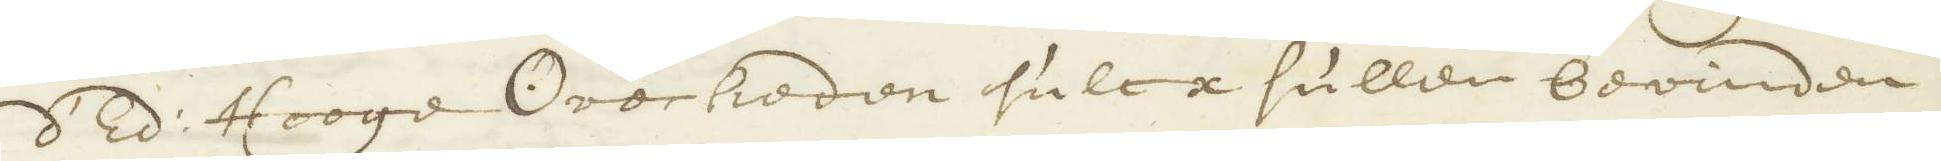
d’Ed: Hooge Overheden sulcx sullen bevinden
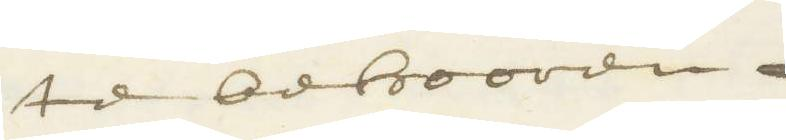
te behooren
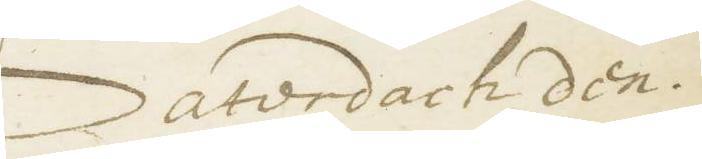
Saterdach den.
